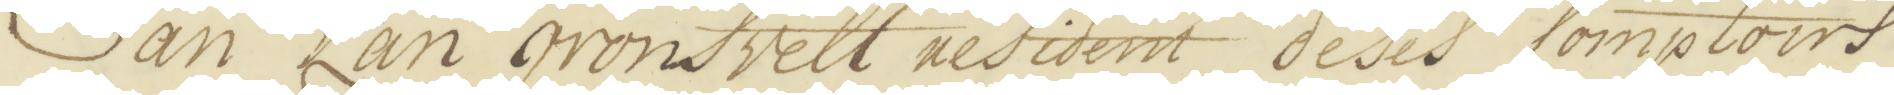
Jan Van gronsvelt resident deses Comptoirs
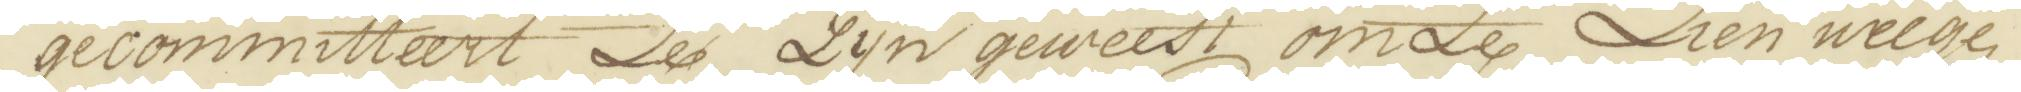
gecommitteert te zijn geweest om te zien weegen
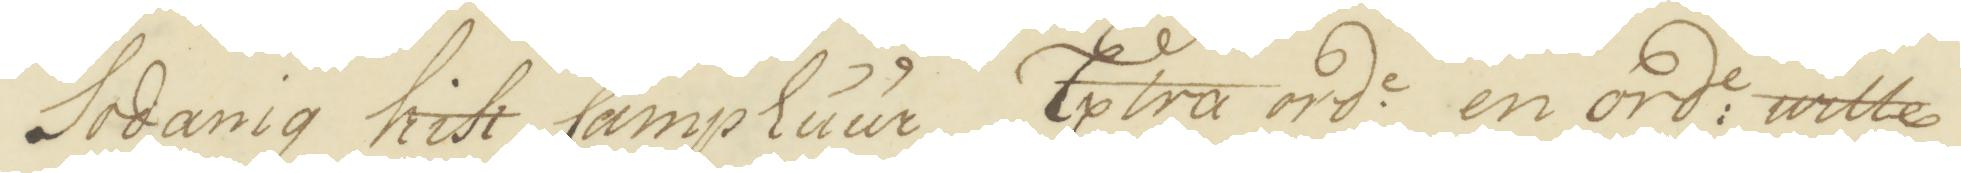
sodanig kist Camphuur Extra ord:e en ord:e witte
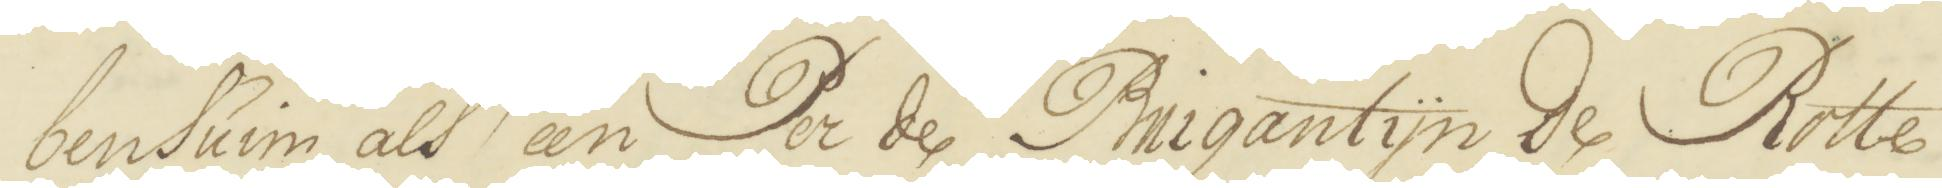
bensuin als een Per de Brigantijn de Rotte
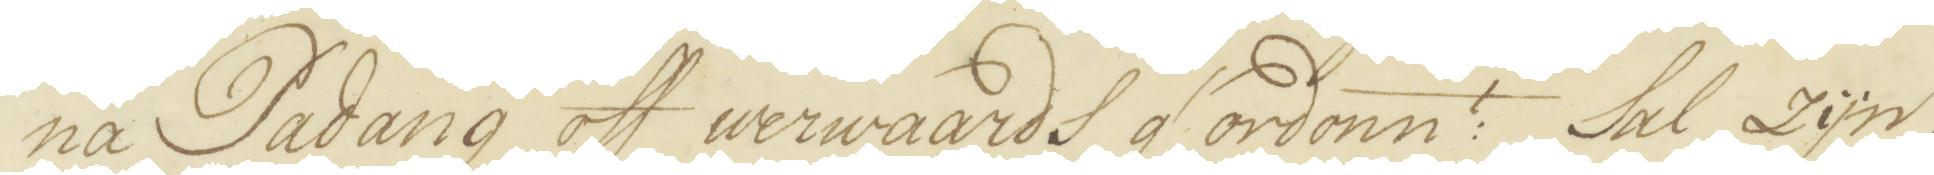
na Padang off werwaards g’ordonn:t sal zijn;
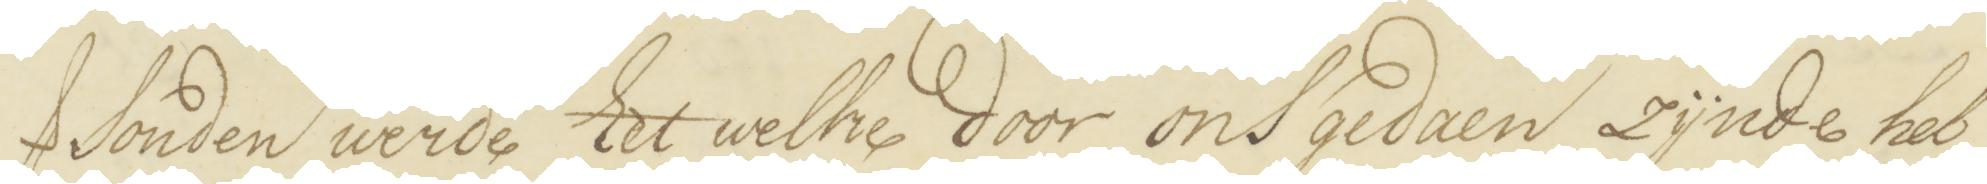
versonden werde het welke door ons gedaen zijnde heb
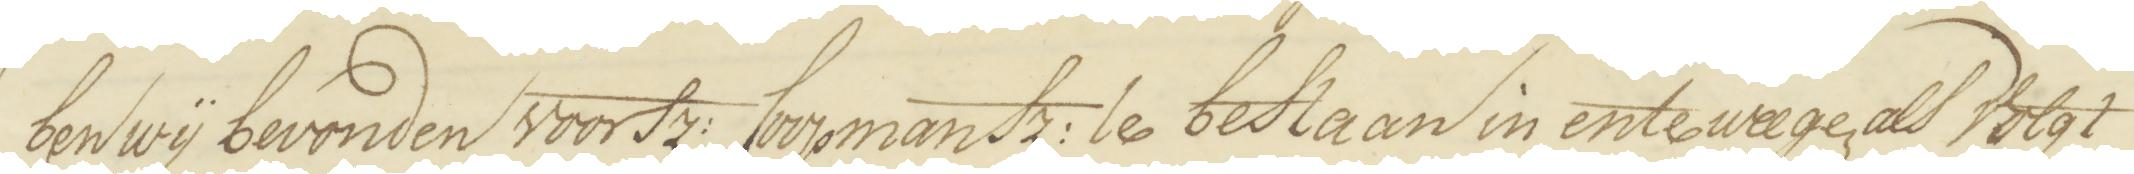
ben wij bevonden voorsz: Coopmansz: te bestaan in ente weegen als Volgt
